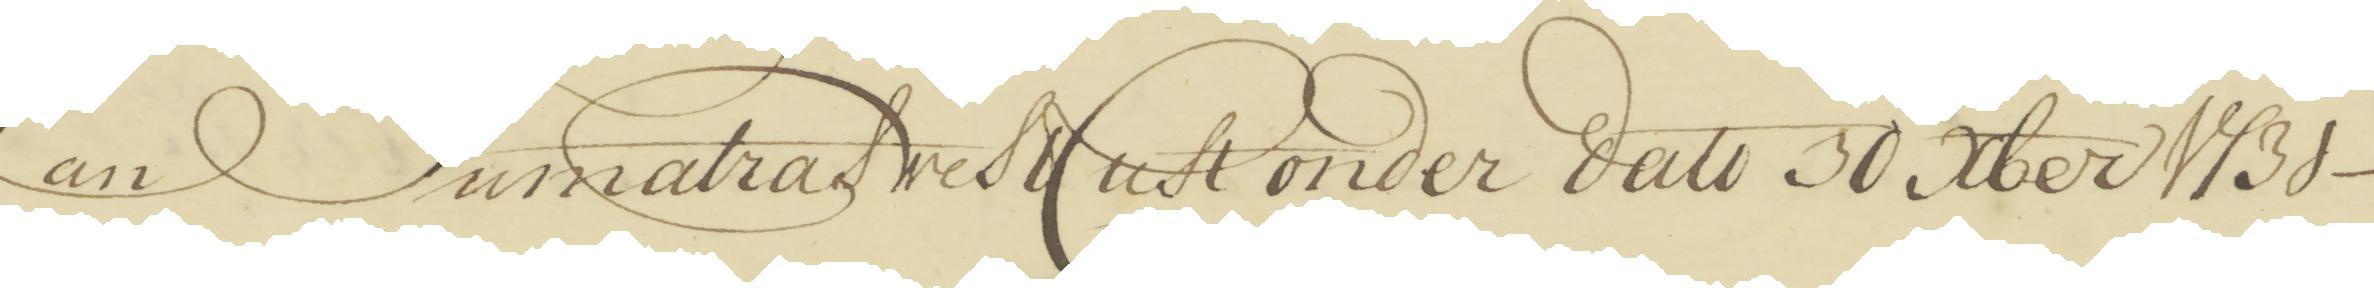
Van Sumatras West Cust onder dato 30 xber 1738—
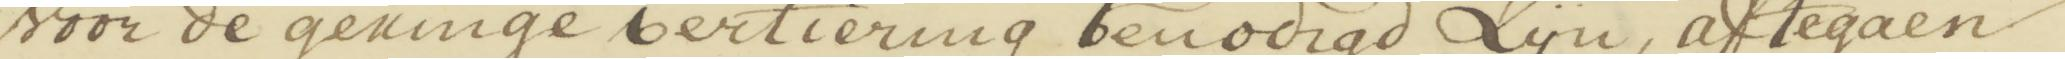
voor de geringe vertiering benodigd zijn, aftegaen
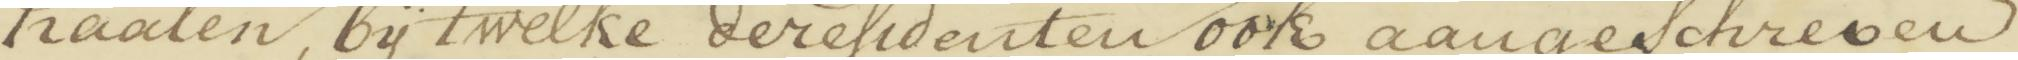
haalen, bij twelke deresidenten ook aangeschreven
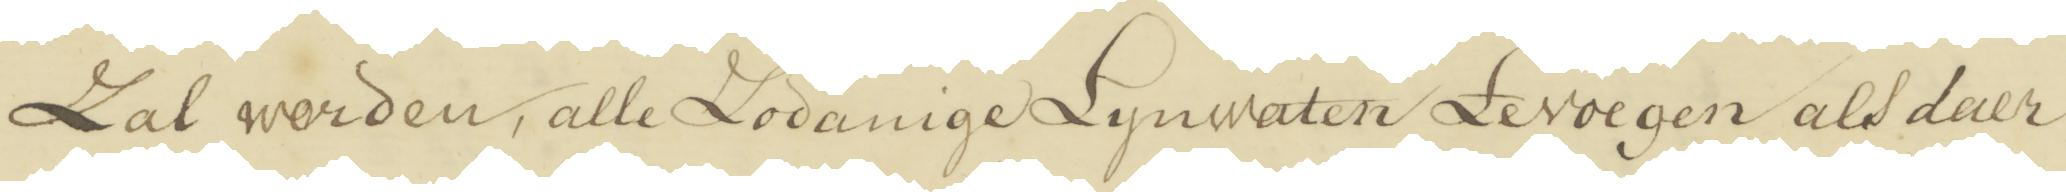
zal werden, alle zodanige Lynwaten tevoegen als daer
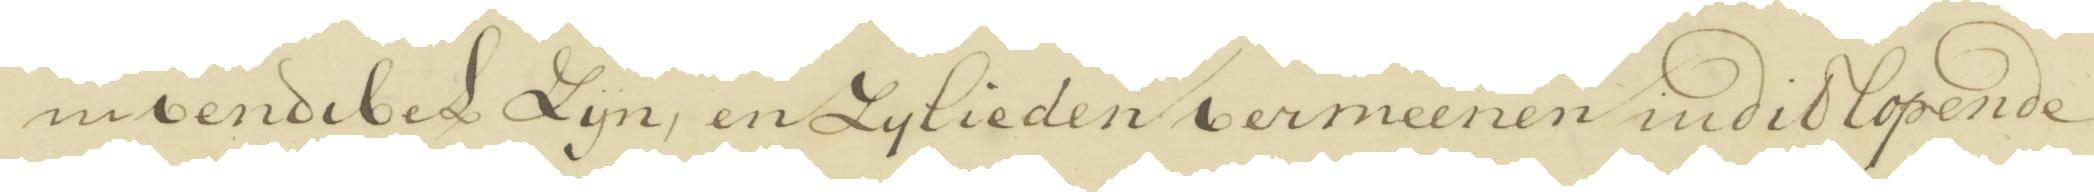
invendibel zijn, en zylieden vermeenen in dit lopende
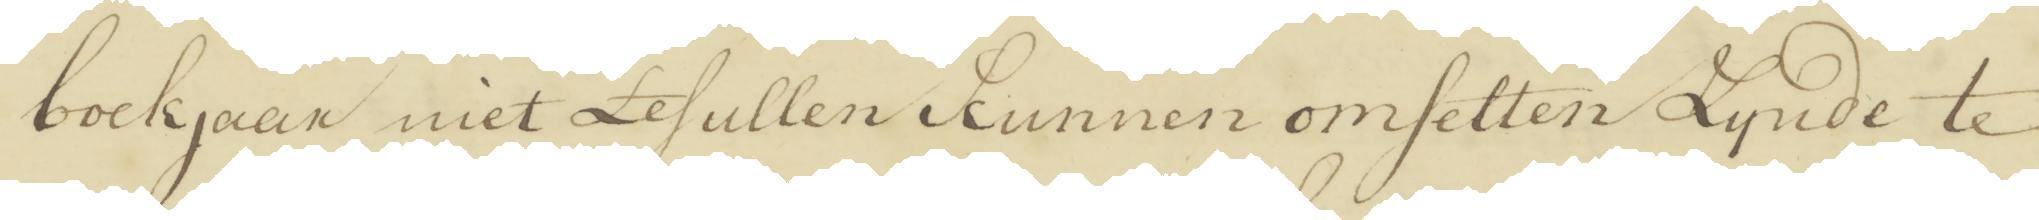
boekjaar niet te sullen kunnen omsetten zynde te
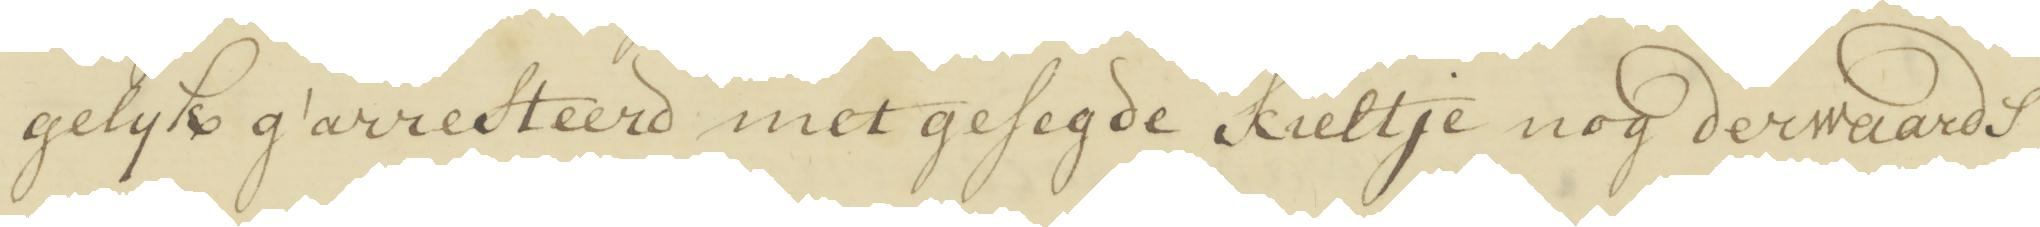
gelyk g’arresteerd met gesegde kieltje nog derwaards
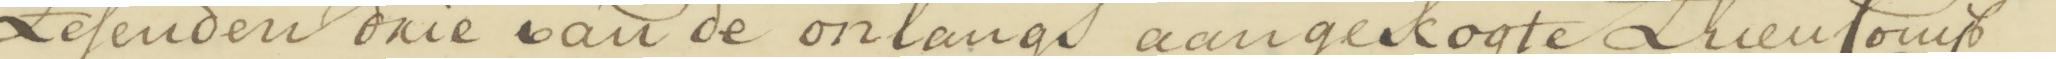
tesenden drie van de onlangs aangekogte thien Comps
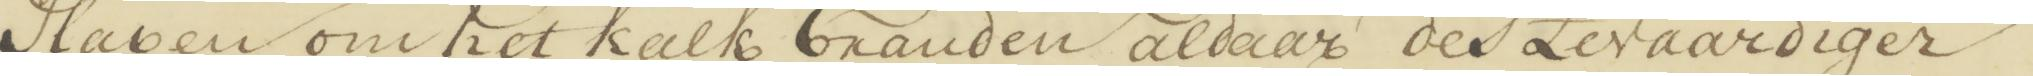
slaven om het kalk branden aldaar des tevaardiger
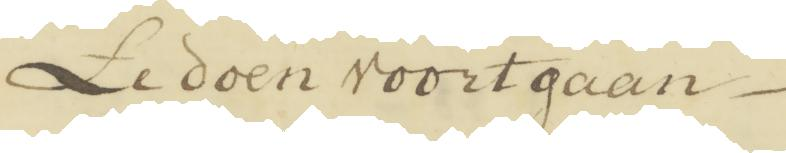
te doen voortgaan —
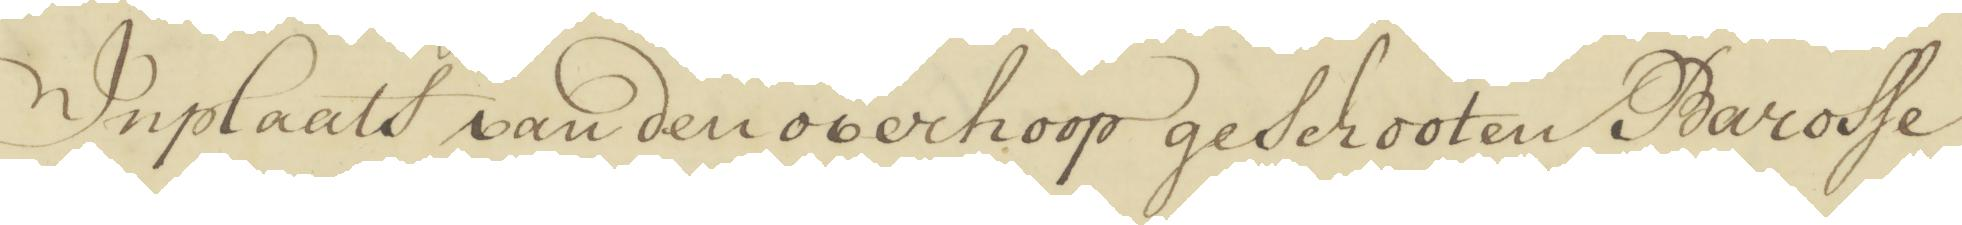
In plaats van den overhoop geschooten Barosse
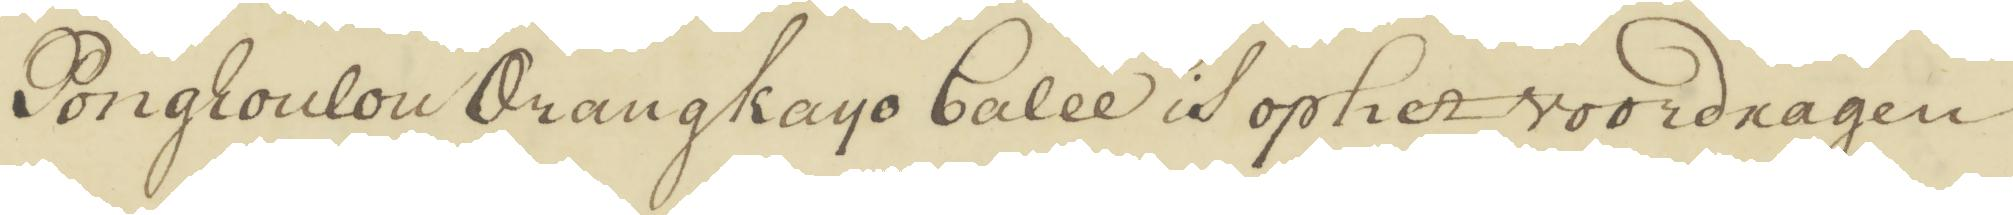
Ponghoulou Orangkayo balee is op het voordragen
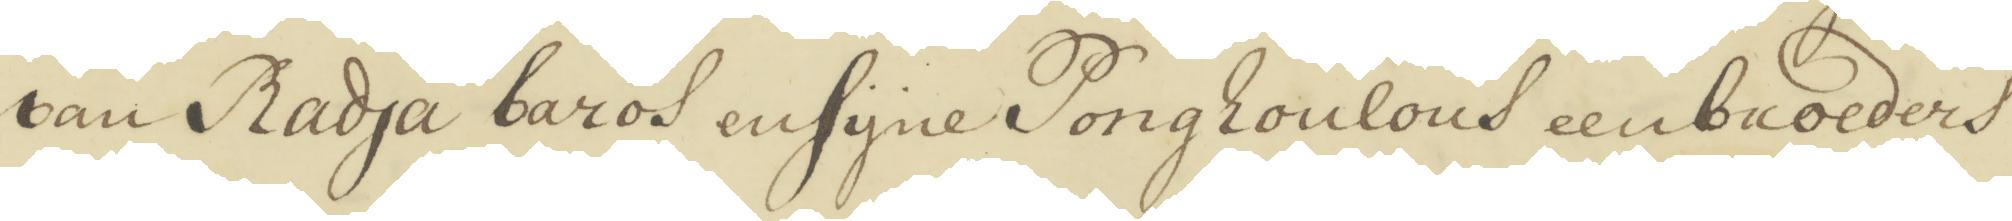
van Radja baros en sijne Ponghoulous een broeders
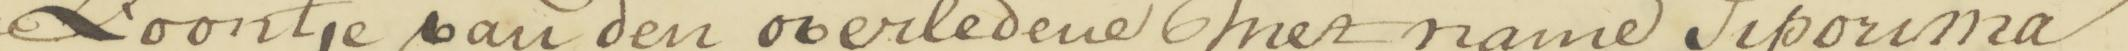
zoontje van den overledene met name Siporima
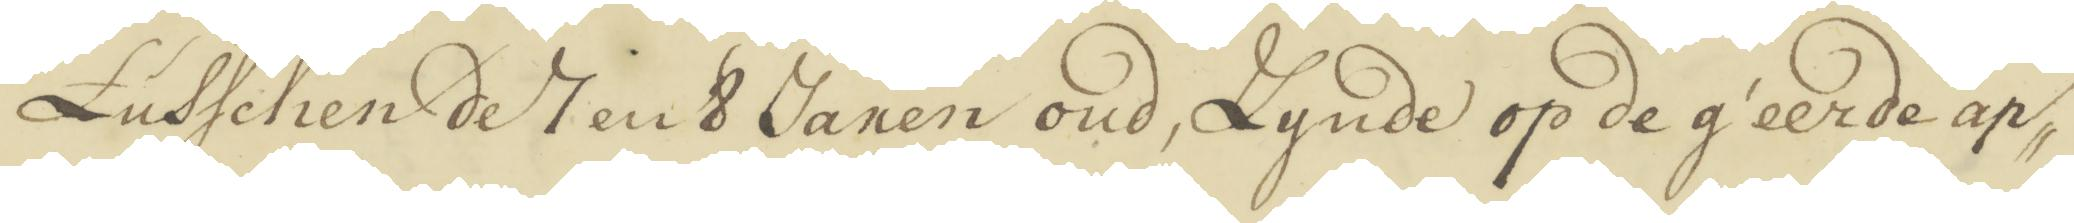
tusschen de 7 en 8 Jaren oud, zynde op de g’eerde ap„
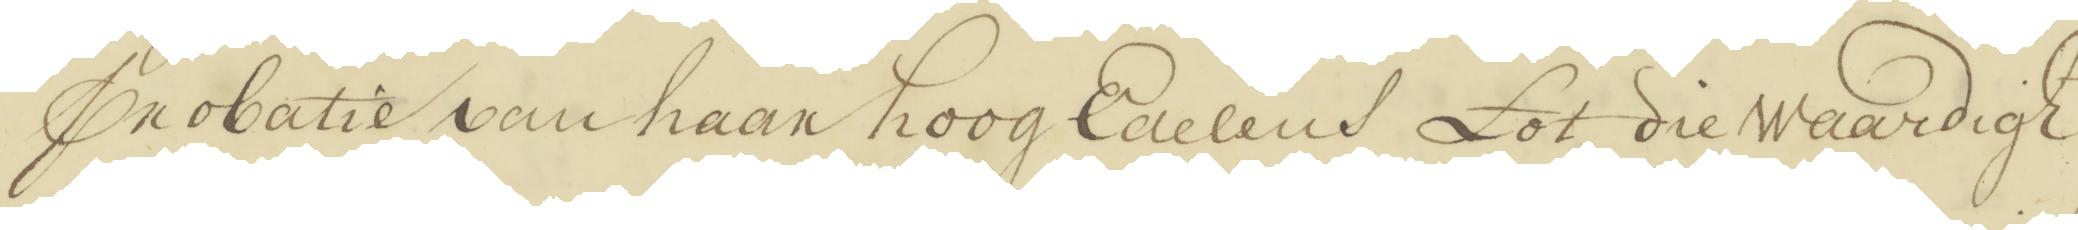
probatie van haar hoog Edelens tot die waardigh
